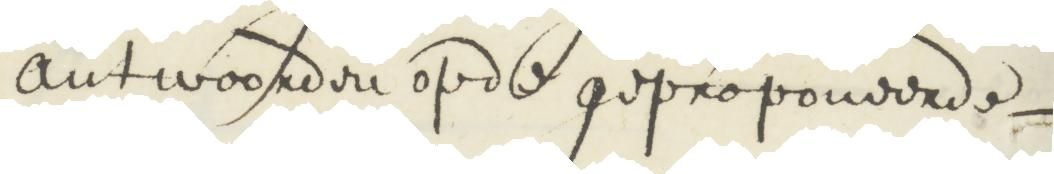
antwoorden op de geproponeerde
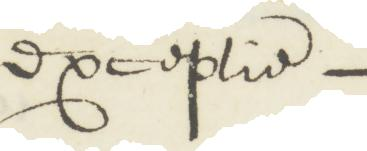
exceptie —
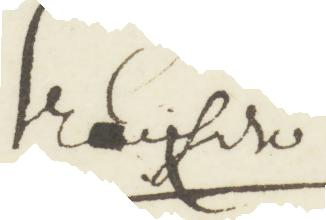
keijser
